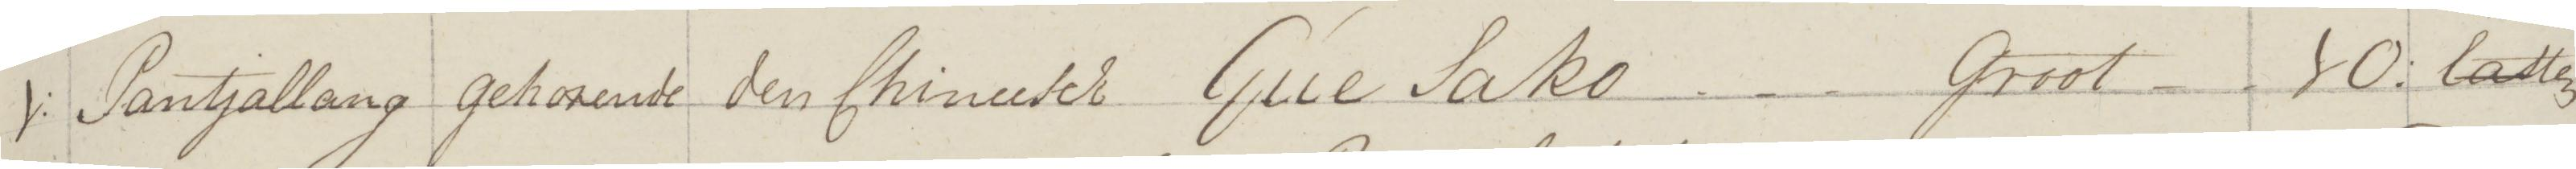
1: Pantjallang gehorende den Chineesch Gue sako Groot 10: lasten
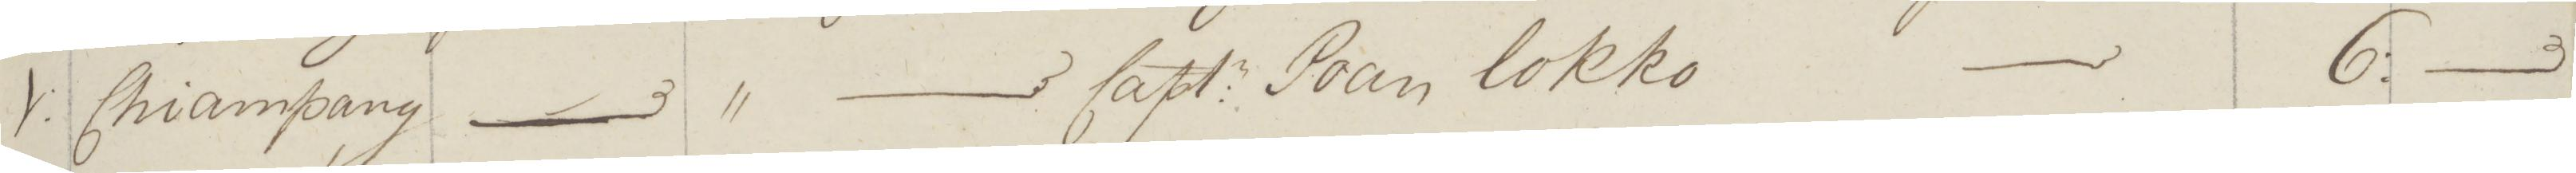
1: Chiampang _o „ _o Capt:n Poan lokko _o 6: _o
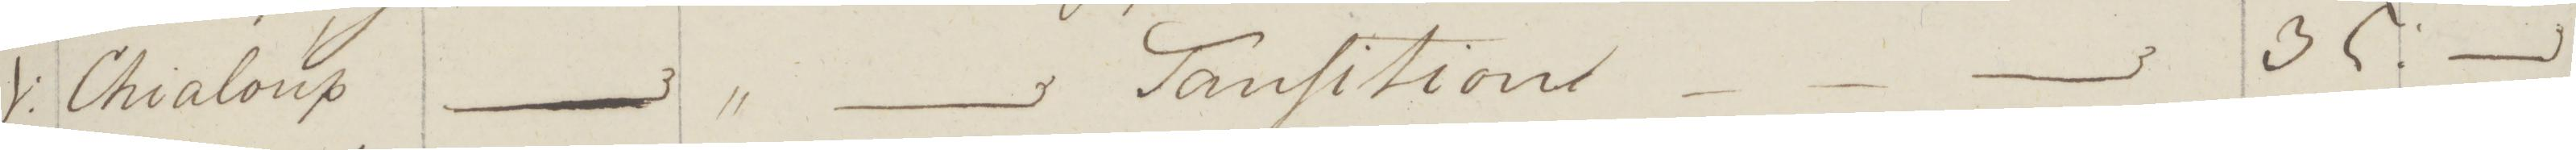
1: Chialoup _o „ _o Tansition _o 35: _o
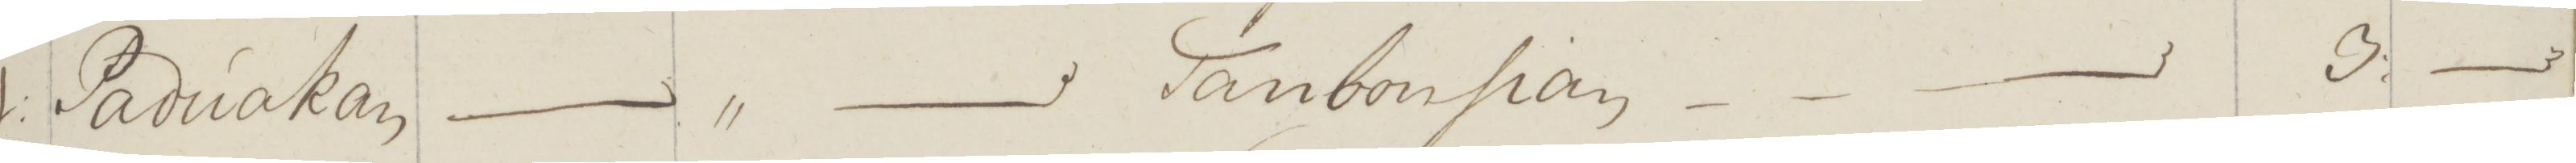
1: Paduakan _o „ _o Tanbonsian _o 3: _o
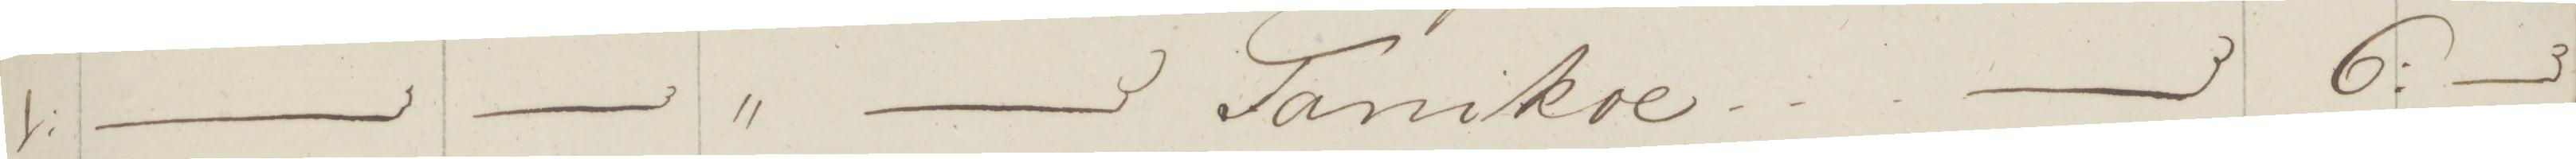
1: _o _o „ _o Tanikoe _o 6: _o
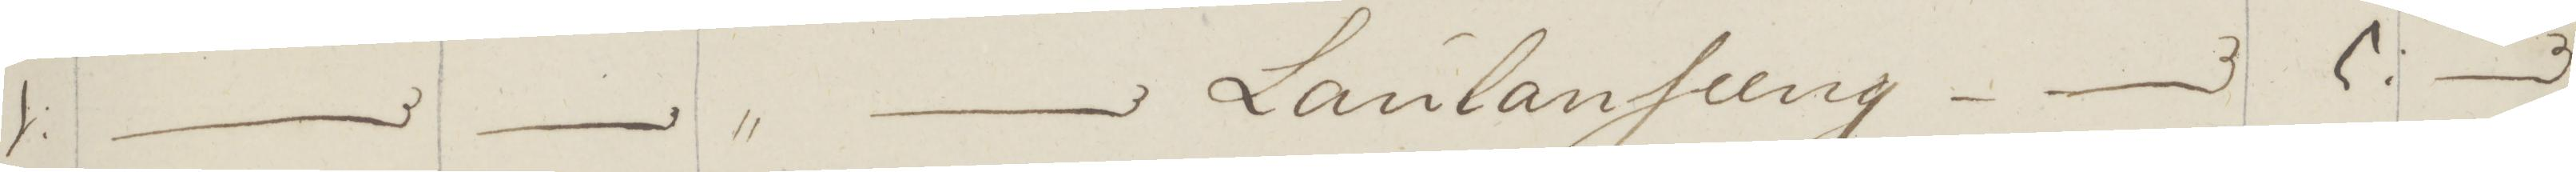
1: _o _o „ _o Laulanseeng _o 5„ _o
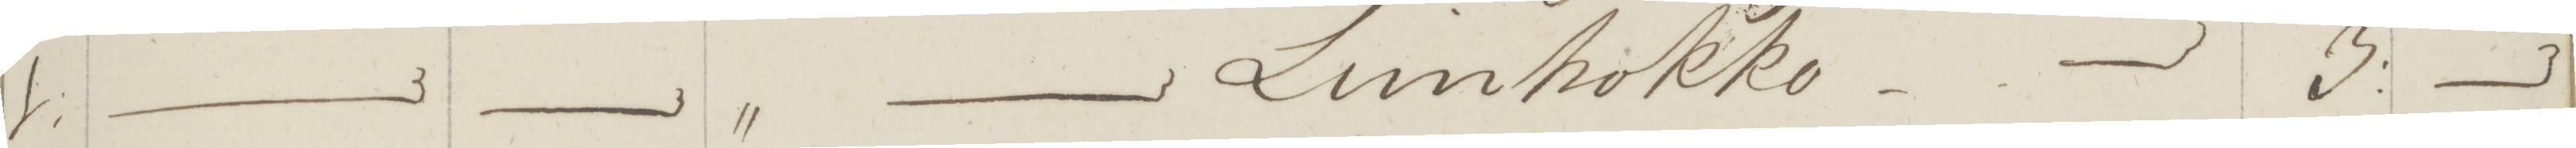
1: _o _o „ _o Lunhokko _o 3: _o
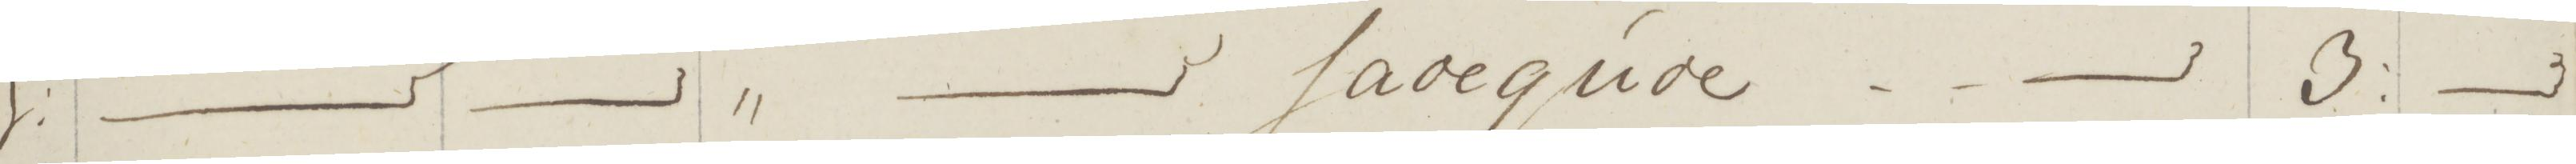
1: _o _o „ _o saoequoe _o 3: _o
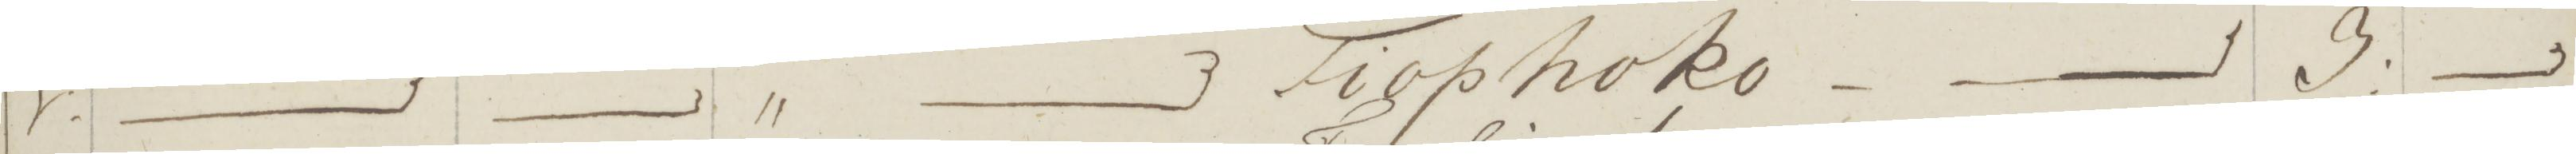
1: _o _o „ _o Tiophoko _o 3: _o
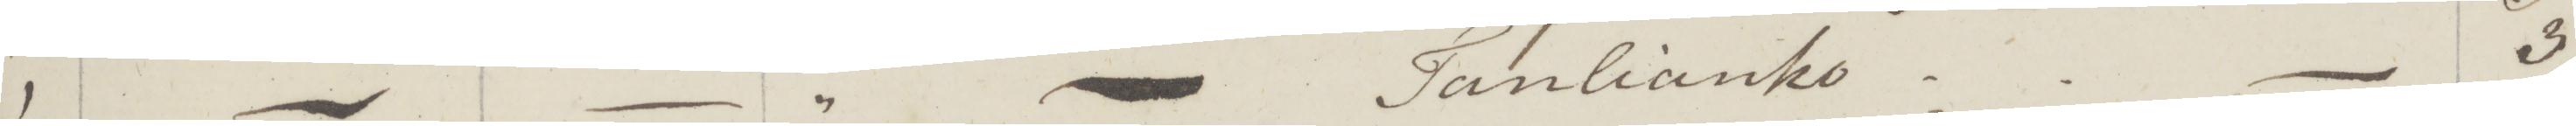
1 _ _ „ _ Tanlianko _ 3
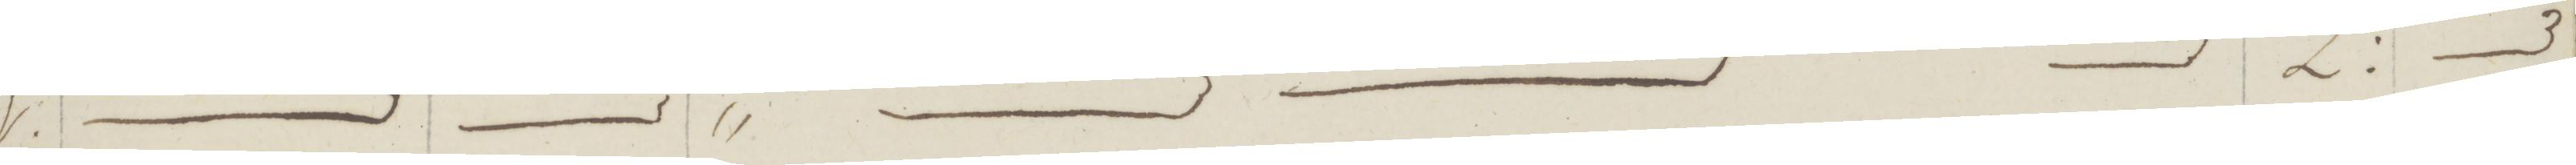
1: _o _o „ _o _o _o 2: _o
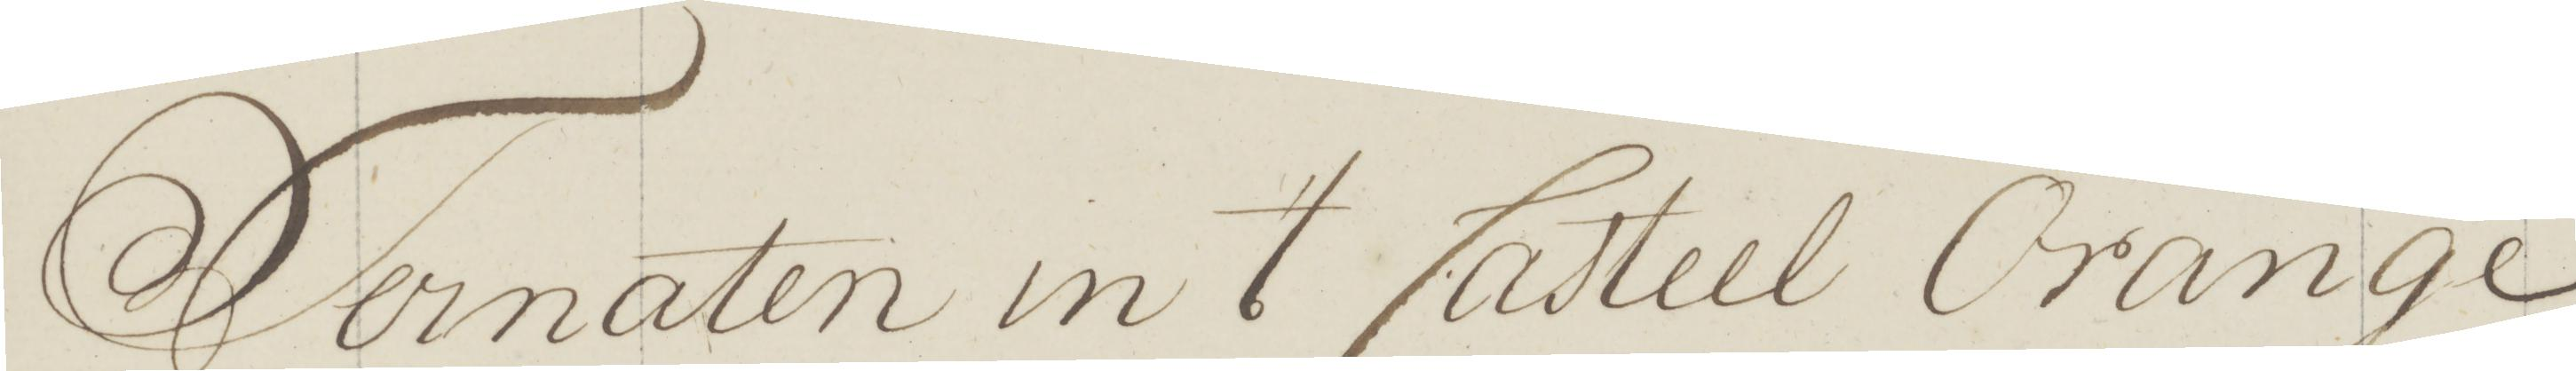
Ternaten in ’t Casteel Orange
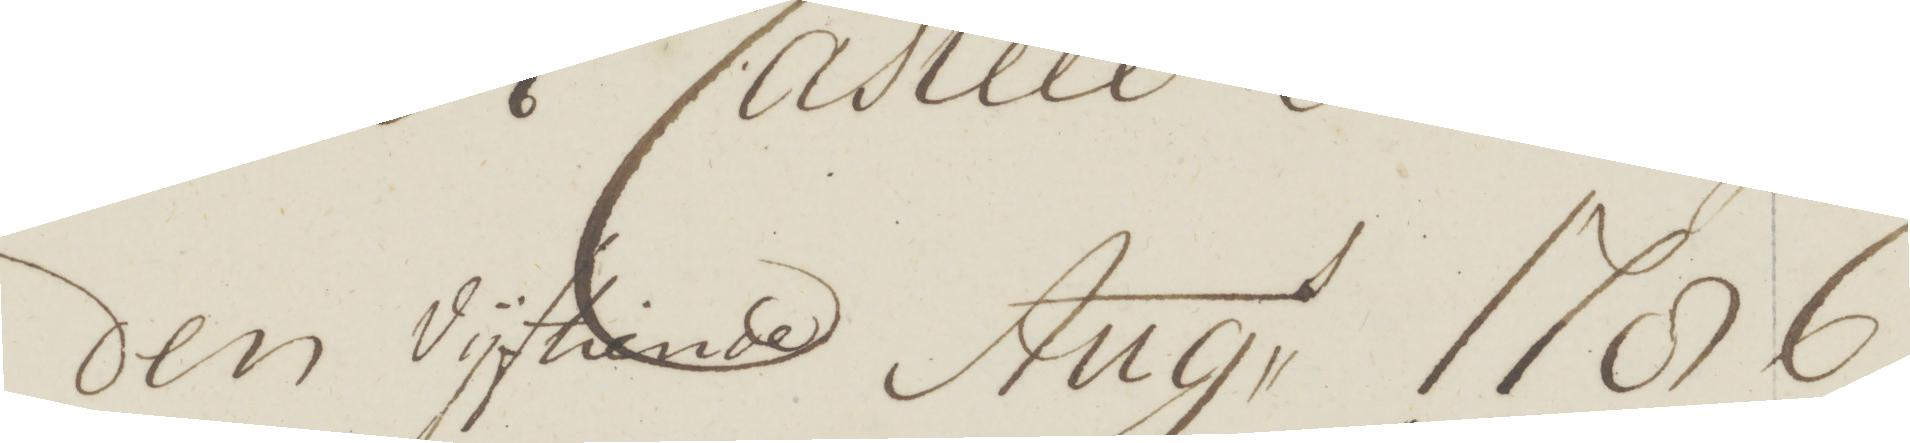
den vijftiende Aug„s 1786
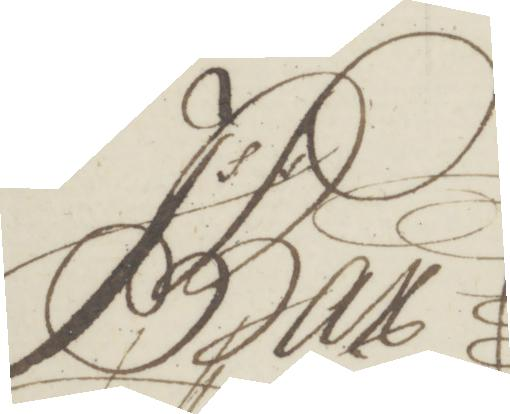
J„s Bax
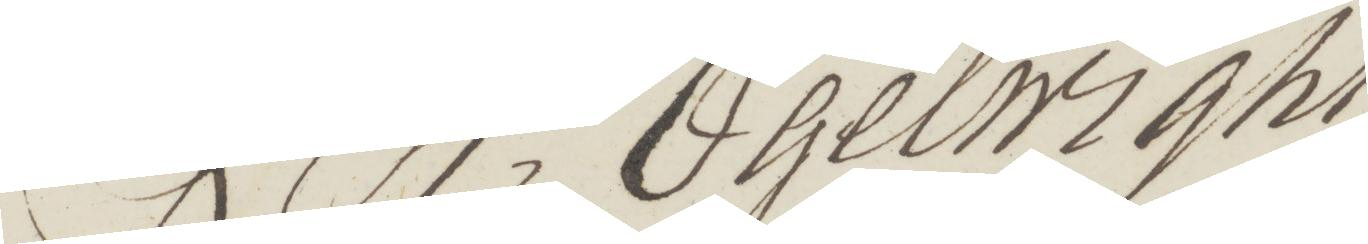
J,s Ogelwight
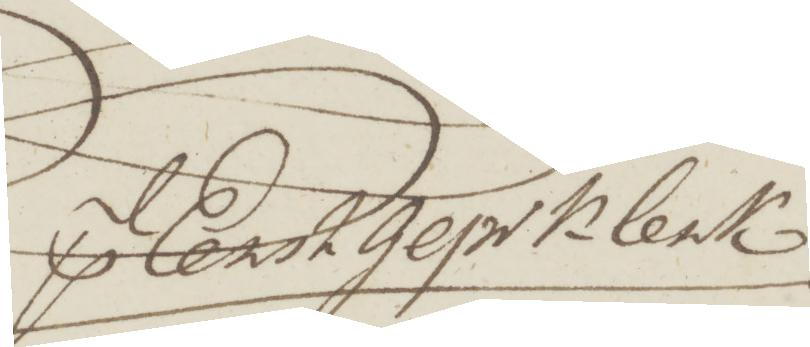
P'l Eerst gesw klerk
